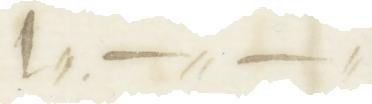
1„ —„ —„
